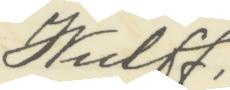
Wulff.
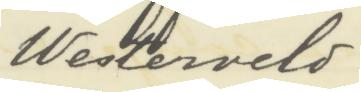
Westerveld
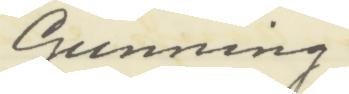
Gunning
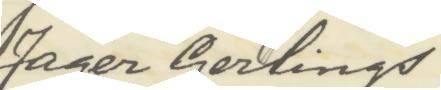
Jager Gerlings
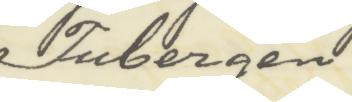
Tubergen
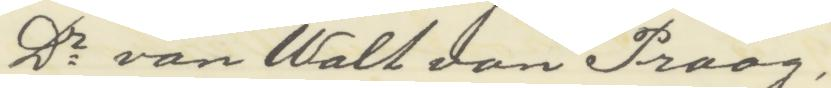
D=r van Walt van Fraag,
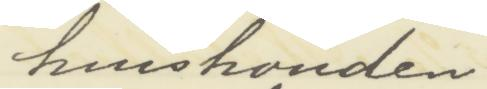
huishouden
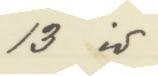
13 id
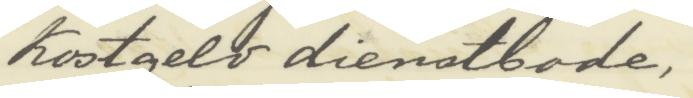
Kostgeld dienstbode,
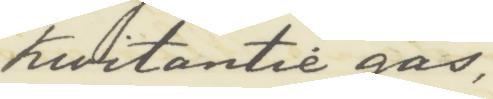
Kwitantie gas,
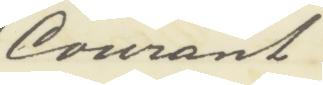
Courant
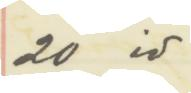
20 id
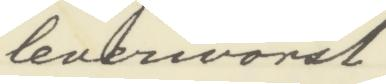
leverworst
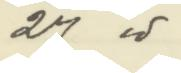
27 id
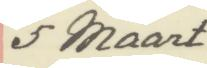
5 Maart
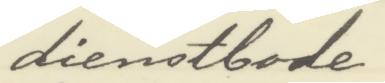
dienstbode
